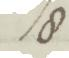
/8
